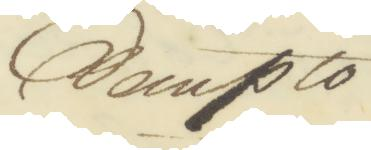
dempto
